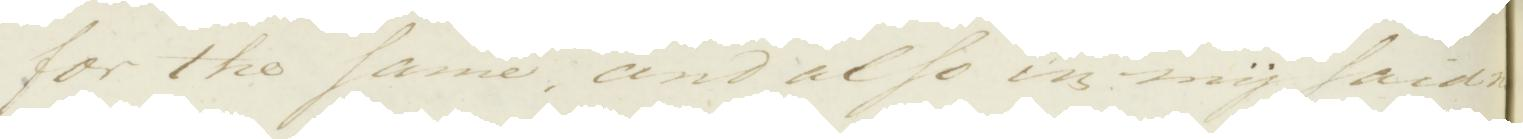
for the same, and also in mij said n
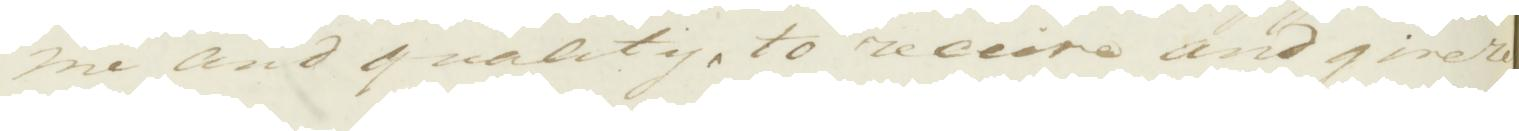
me and quality^ to receive and give re
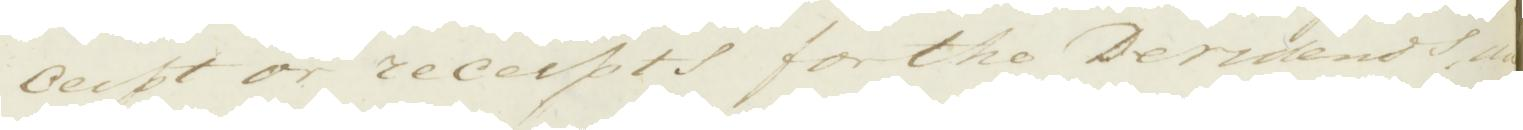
ceipt or receipts for the Devidends, an
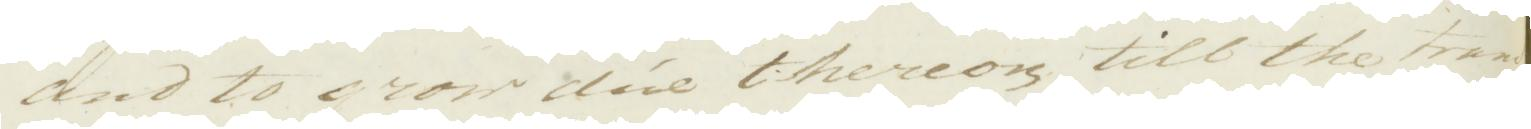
and to grow due thereon till the trans
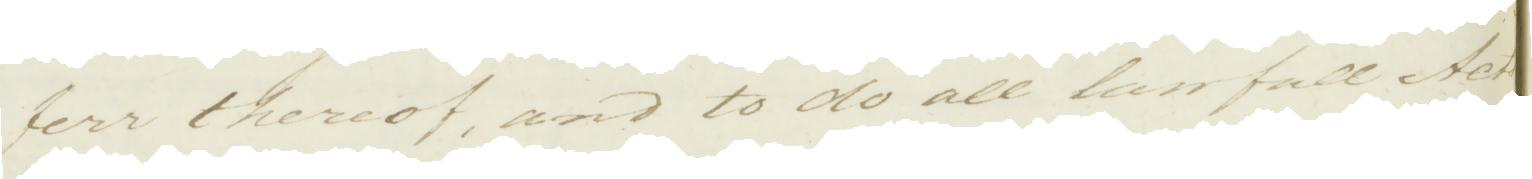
ferr thereof, and to do all lawfull Acts
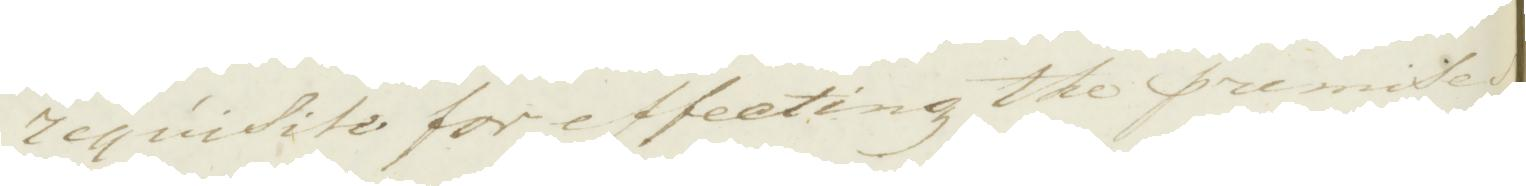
requisite for effecting the premises,
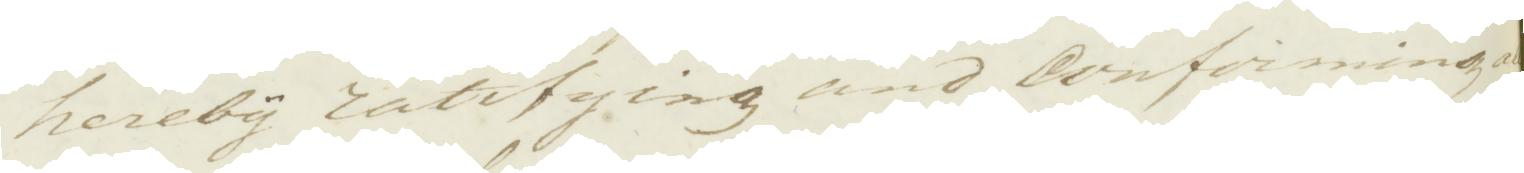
herebij ratifying and confirming al
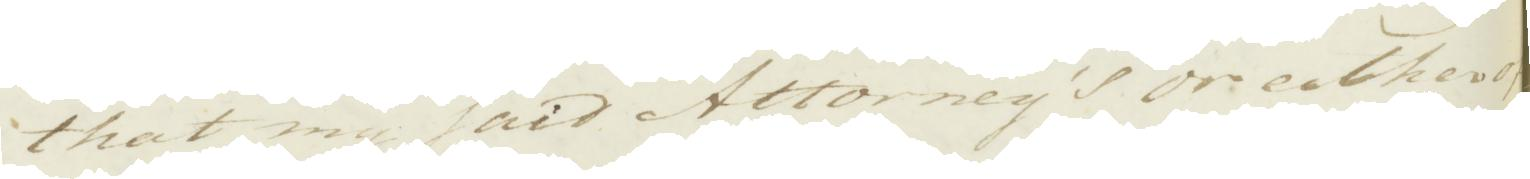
that my said Attorney's or eachen o
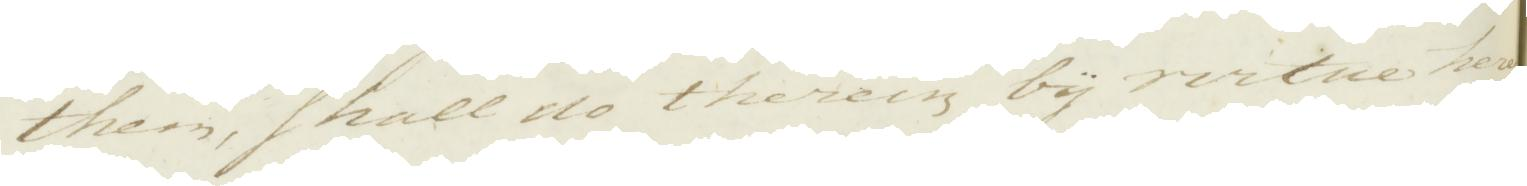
them, shall do therein bij virtue here
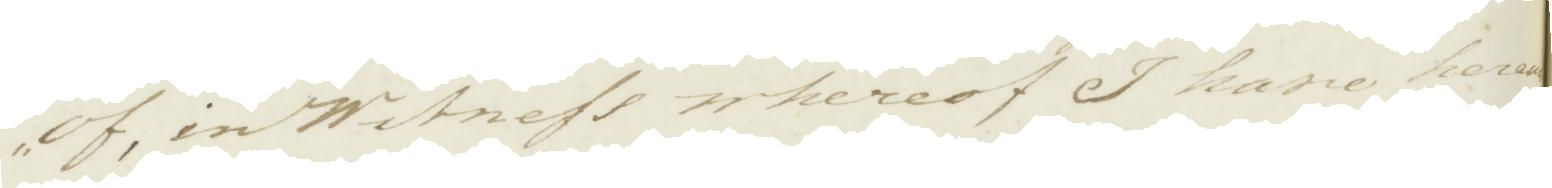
„of, in Witness whereof I have here
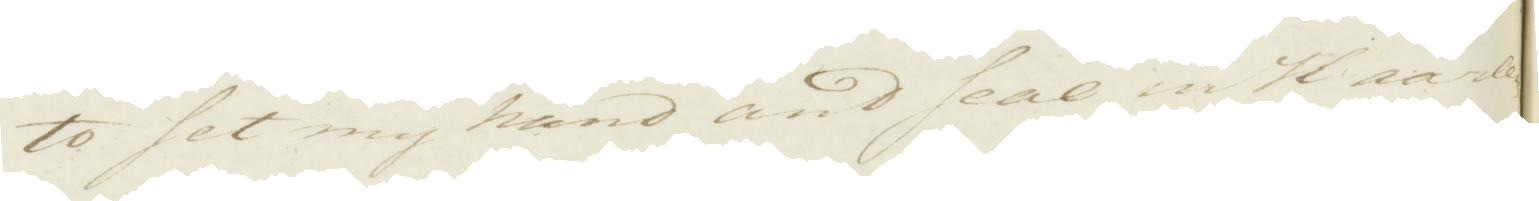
to set my hand and seal in Haarle
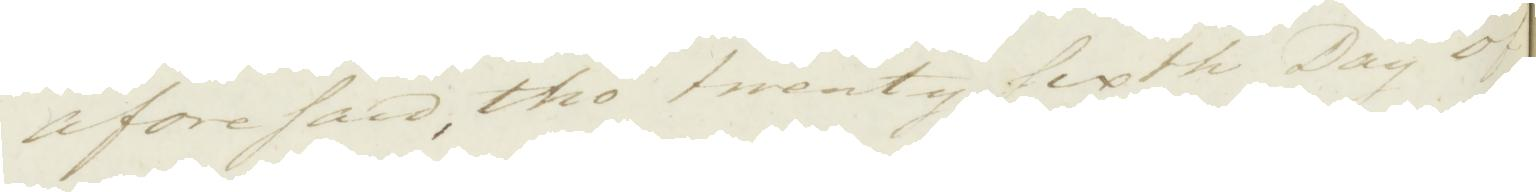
aforesaid, the twenty sixth Day of
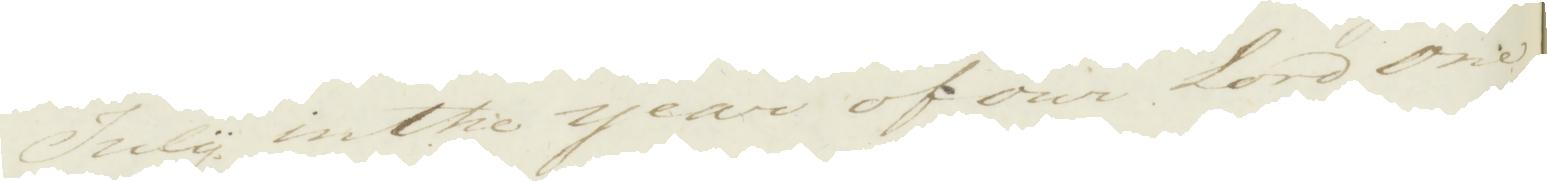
Julij in the year of our Lord One
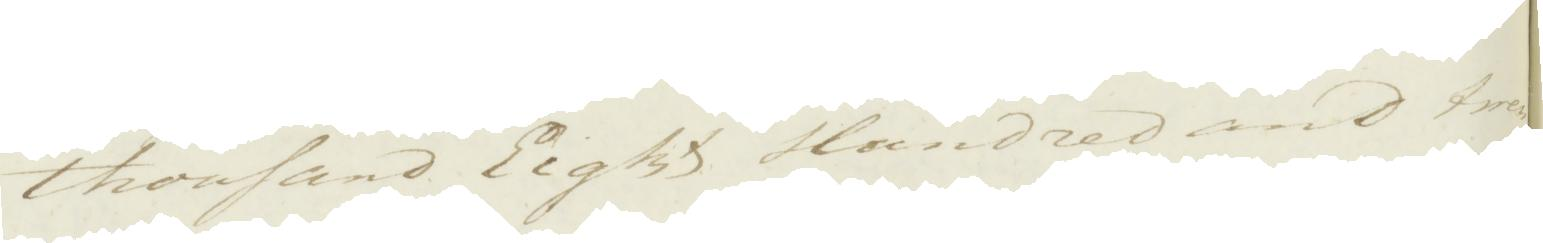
Thousand Eight Hundred and Twen
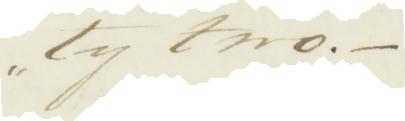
„ty two.
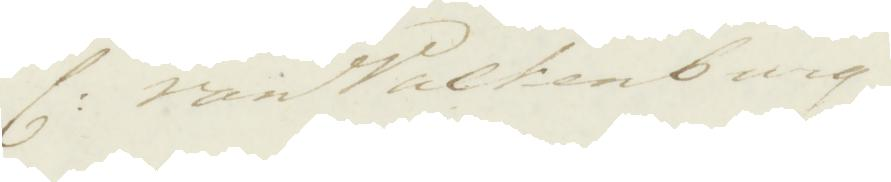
C: van Valkenburg
